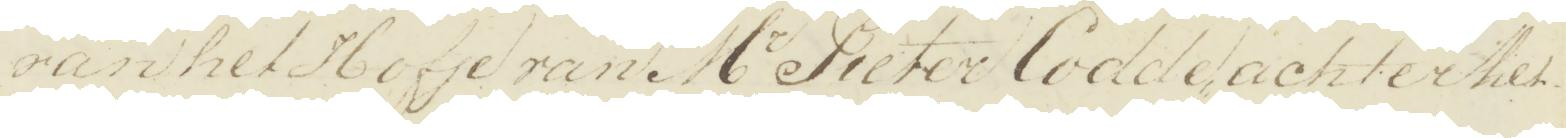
van het Hofje van Mr Pieter Codde, achter het
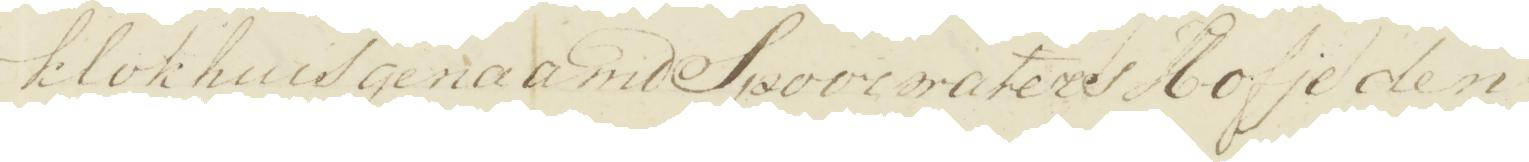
klokhuis genaamd Spoorwaters Hofje den
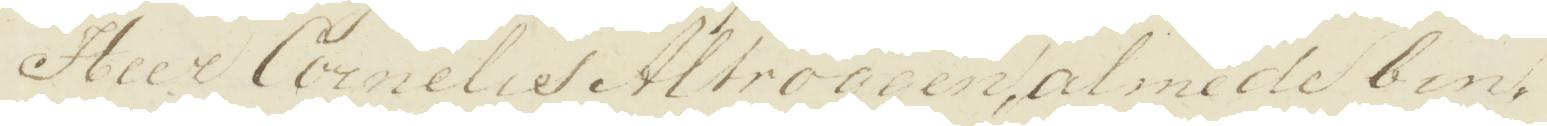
Heer Cornelis Altroggen, almede bin„
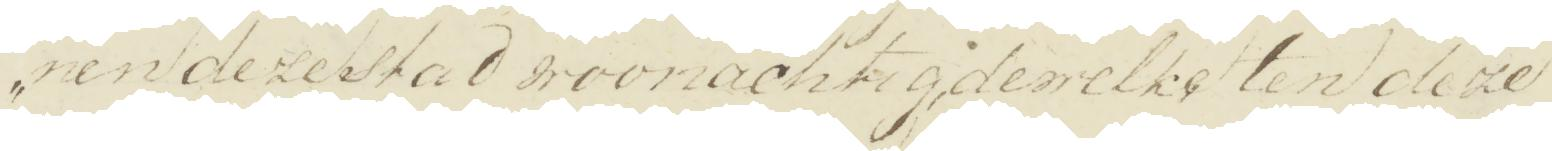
„nen deze stad woonachtig, dewelke ten deze
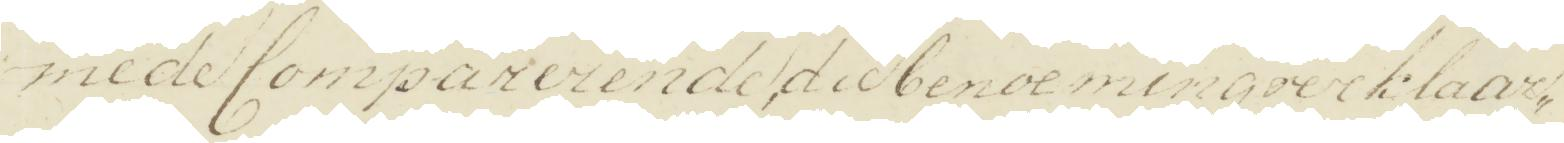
mede Comparerende, die benoeming verklaar„
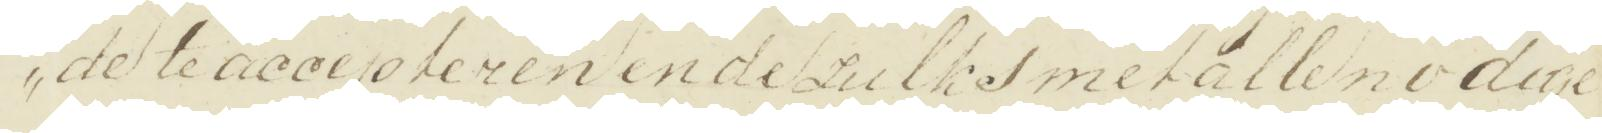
„de te accepteren ende zulks met alle nodige
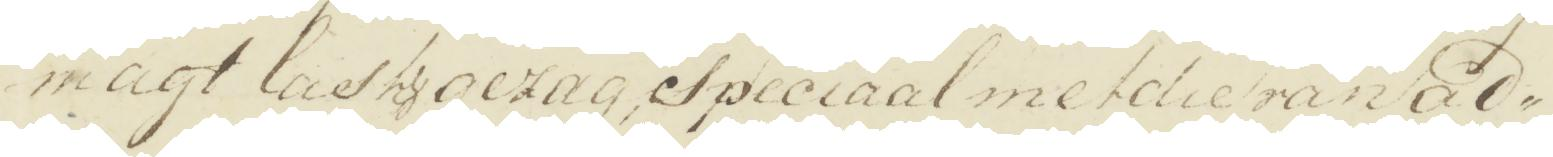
magt last en gezag, speciaal met die van ad„
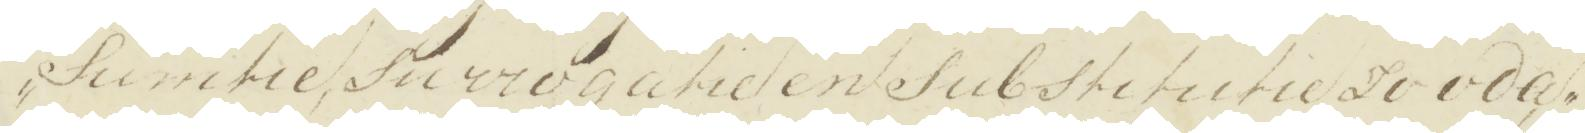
„sumtie, surrogatie en substitutie zooda„
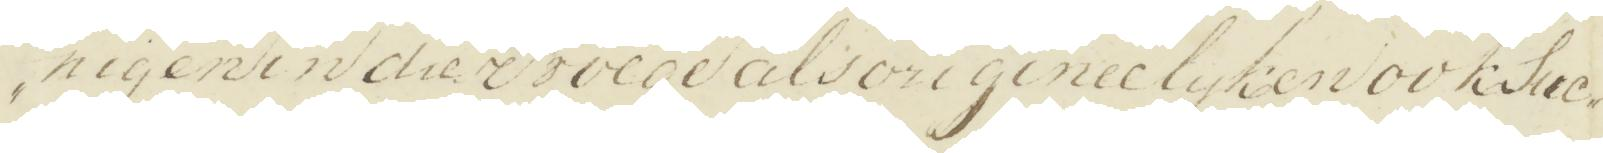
„nigen in dier voege als origineelyk en ook suc„
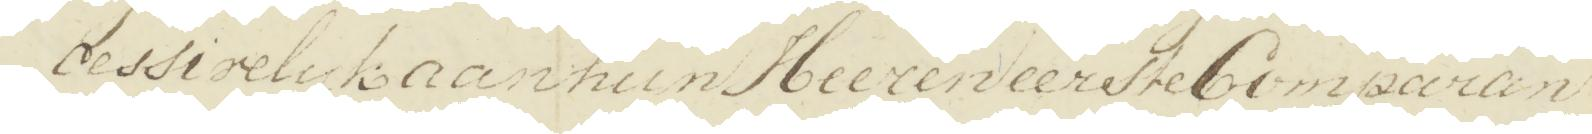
cessivelyk aan hun Heeren eerste Comparan
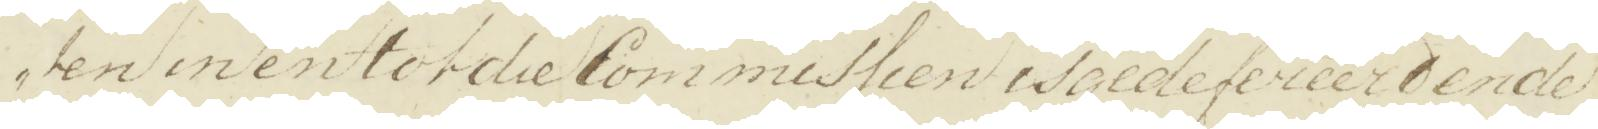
„ten in en tot die Commissien is gedefereerd ende
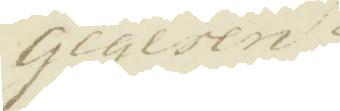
gegeven
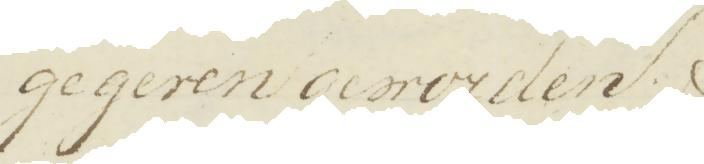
gegeven geworden.
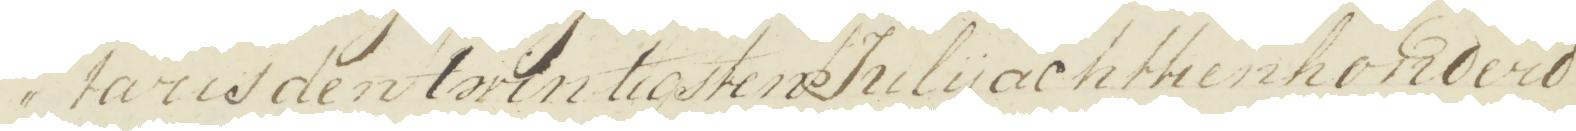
„taris den twintigsten Iulij achttienhonderd
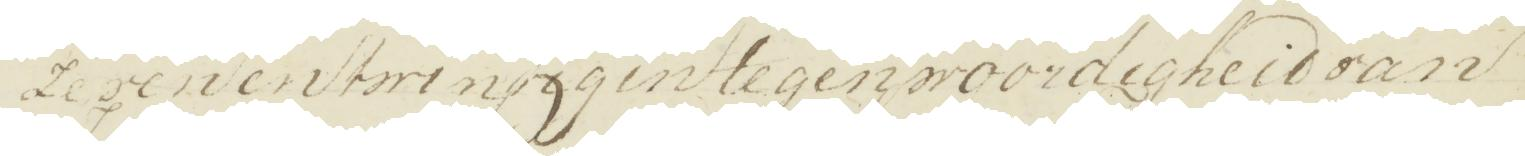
zeven en twintig in tegenwoordigheid van
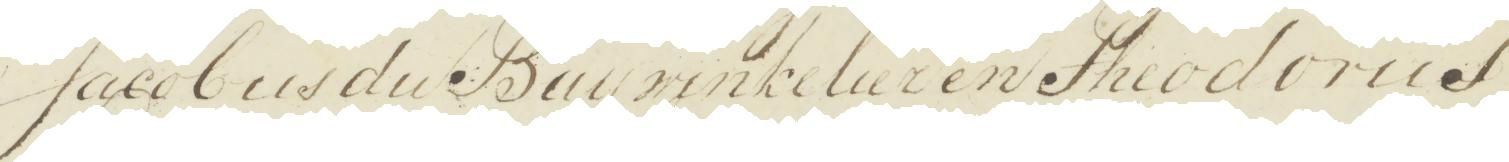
Jacobus du Buy winkelier en Theodorus
